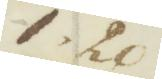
1.20
